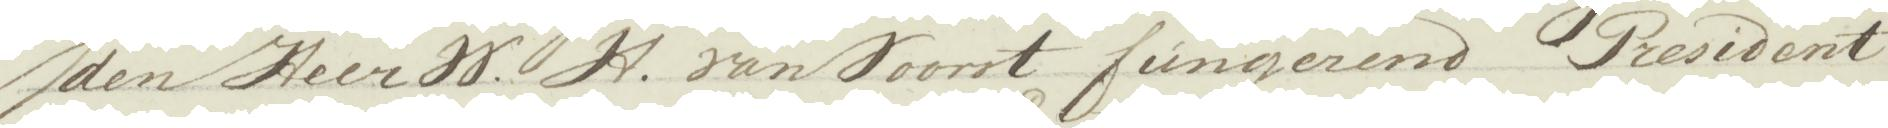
den Heer W. H. van Voorst fungerend President
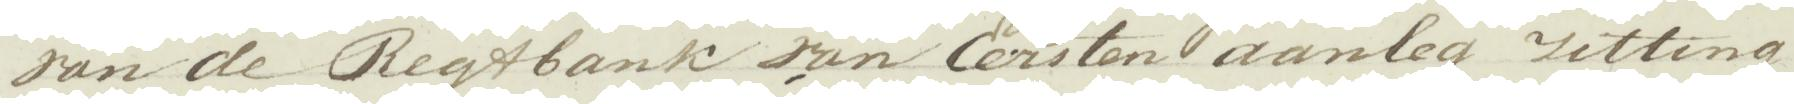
van de Regtbank van Eersten aanleg zitting
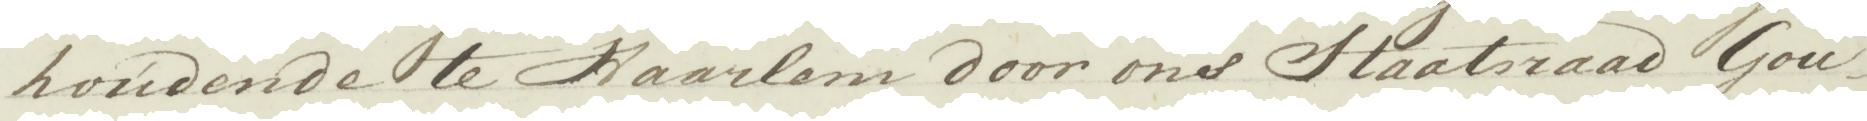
houdende te Haarlem door ons Staatsraad Gou_
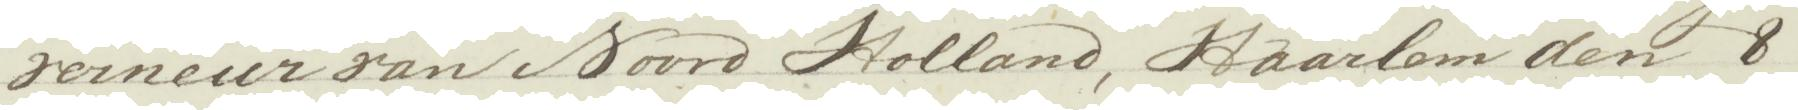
verneur van Noord Holland, Haarlem den 8
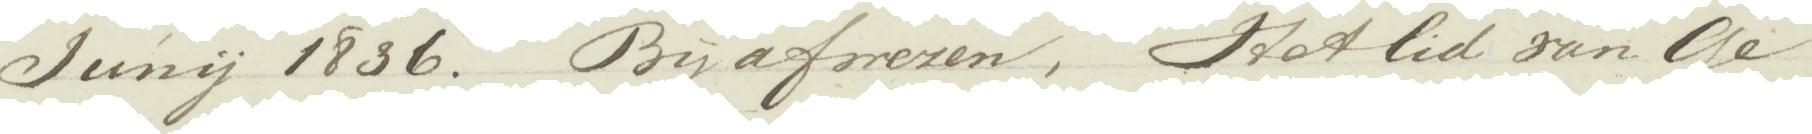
Iuny 1836. Bij afwezen, Het lid van Ge
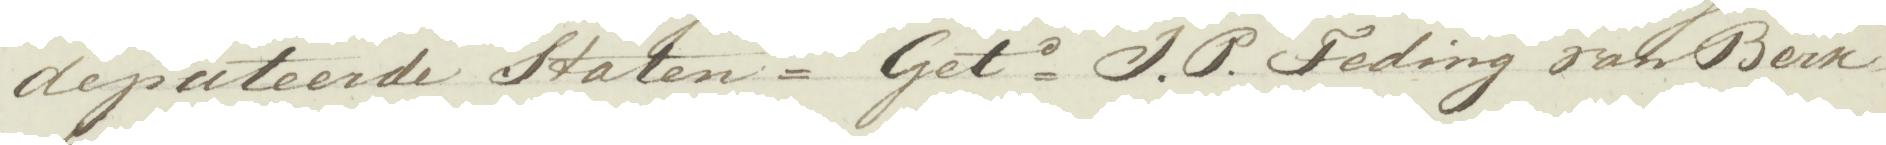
deputeerde staten = Get=d I.P. Teding van Berk
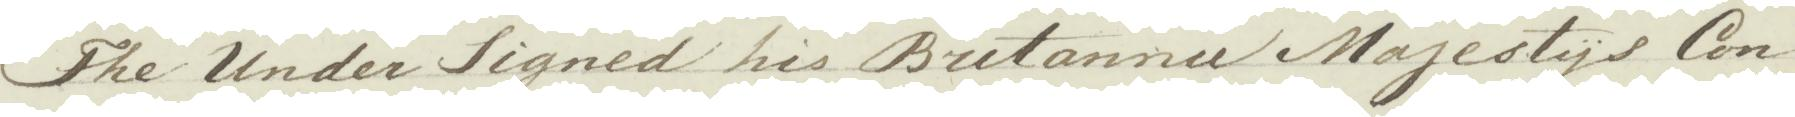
The Under signed his Britannic Majestijs Con
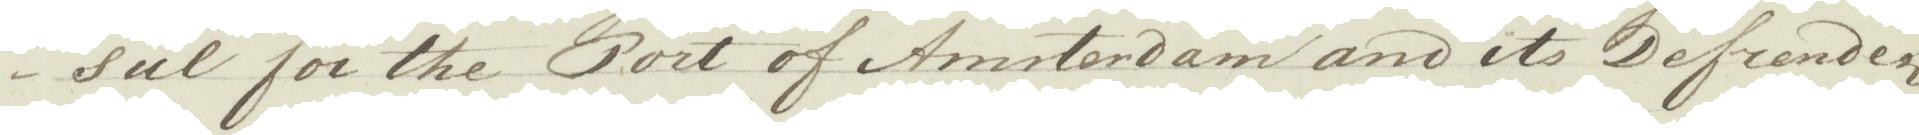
sul for the Port of Amsterdam and its Defrenden
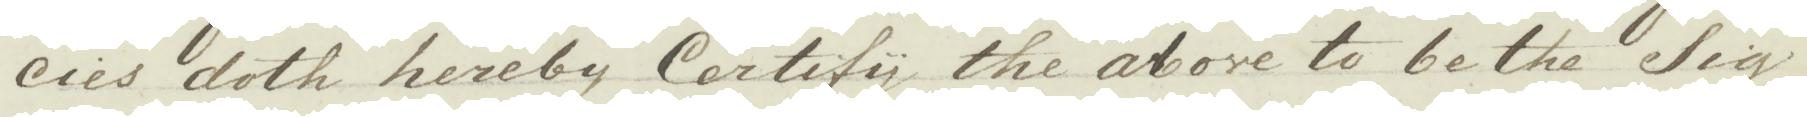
cies doth hereby Certifij the above to be the sig
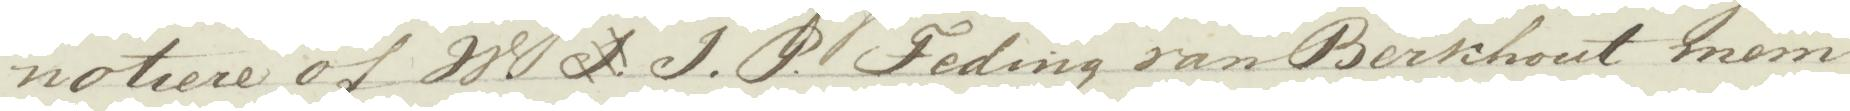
notiere of W.I.I.P. Teding van Berkhout mem
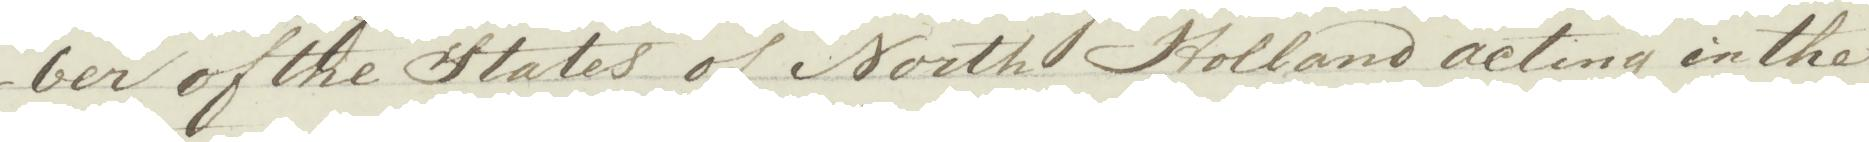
ber of the states of North Holland acting in the
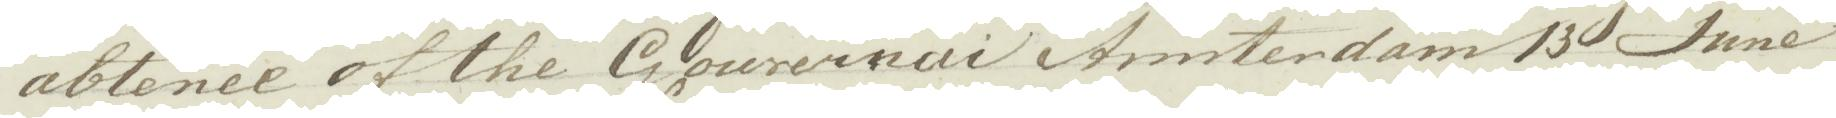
abtenee of the Gouvernai Amsterdam 13 Iune
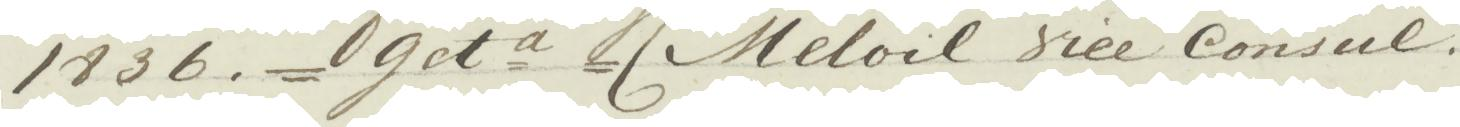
1836. = get=d =Meloil vice consul.
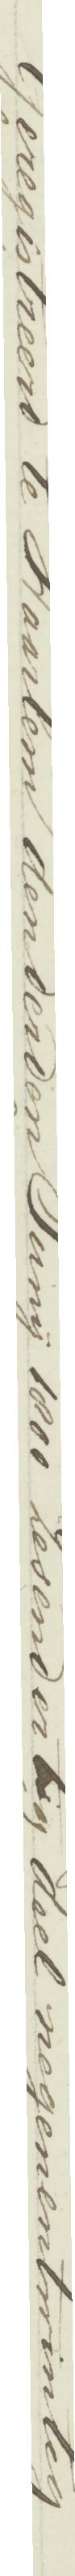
Geregistreerd te Haarlem den derden Iunij 1800 Zesendertig deel negenentwintig
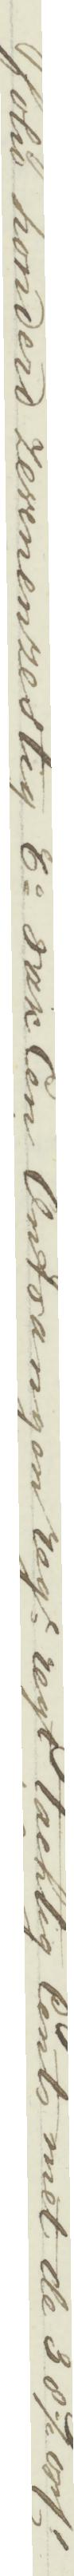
folio honderd zevenenzestig r=o vak Een Ontvangen reg=' regt tachtig Cents met de 38% OpC'
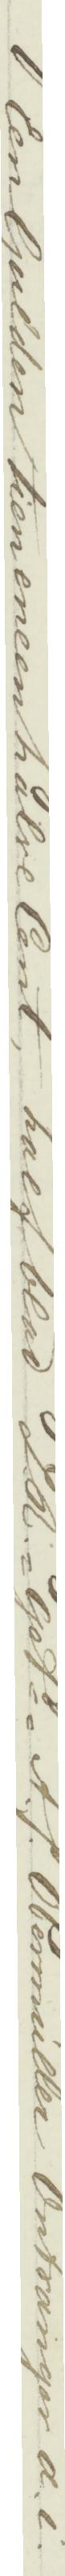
Een Gulden tien eneen halve Cent, half blad Z.R: =get=d= A. F. Obermüller Ontvanger a.i.
